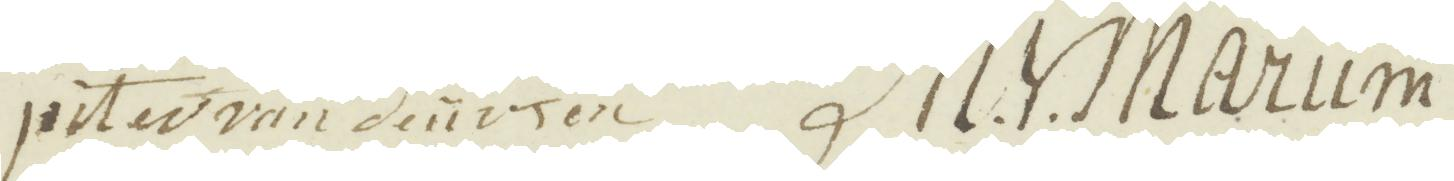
piter van deursen M.V. Marum
